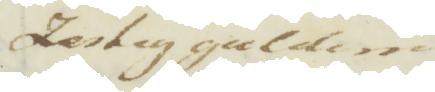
Zestig gulden
